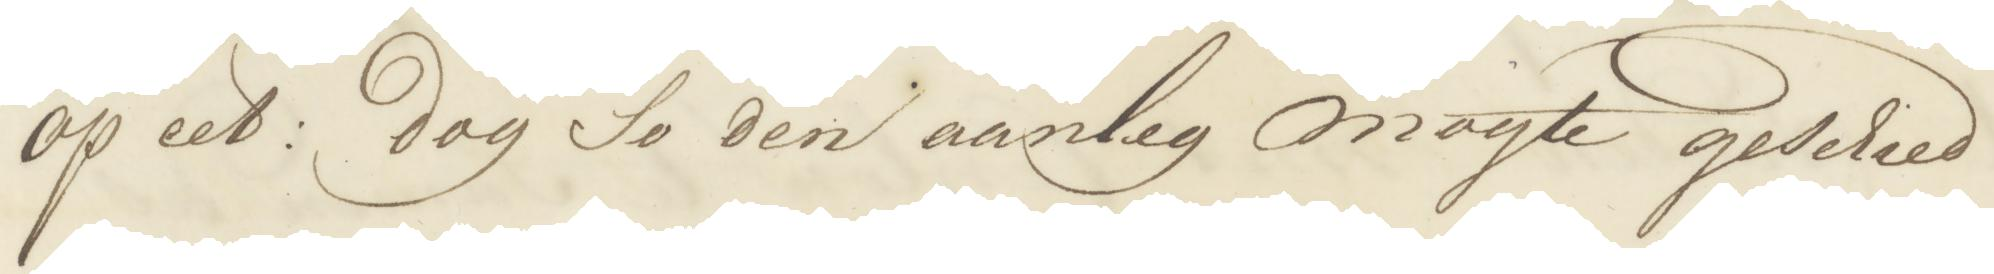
op eet: dog so den aanleg mogte geschied
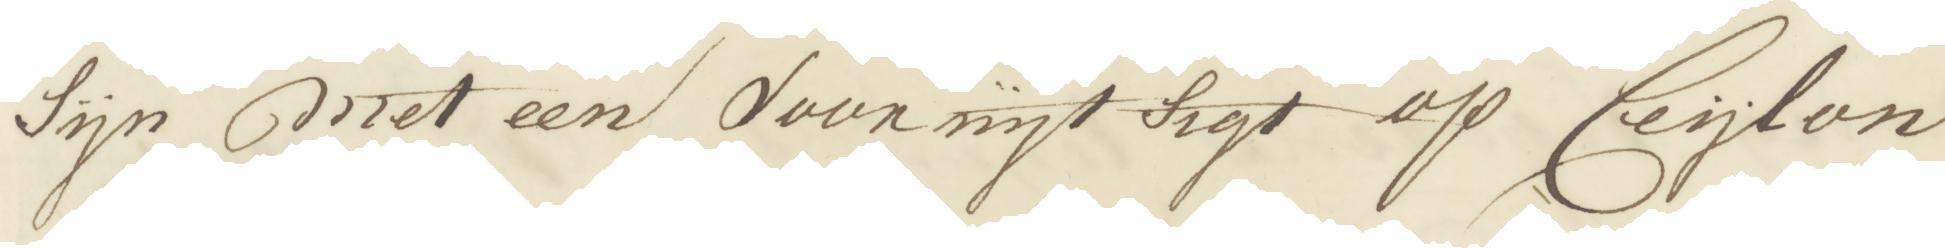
sijn met een voor uijt sigt op Ceijlon
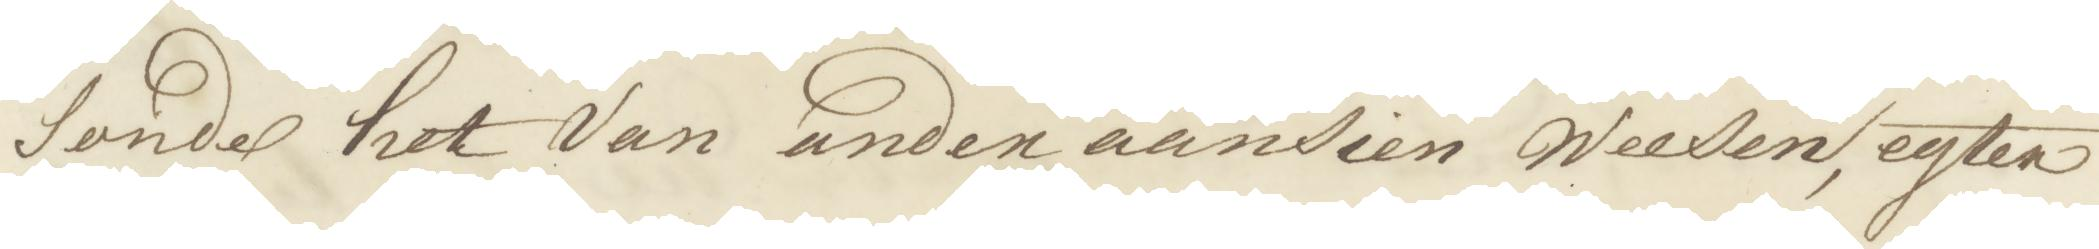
soude het van ander aansien weesen, egter
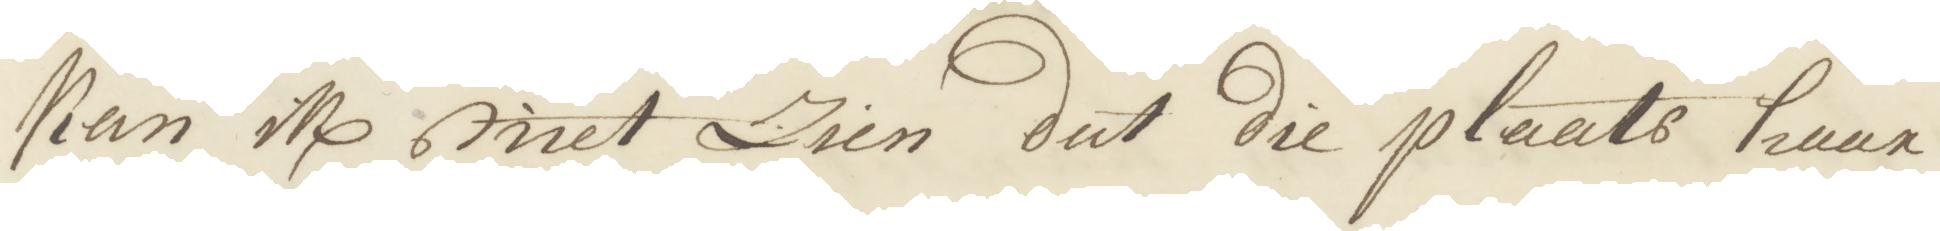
kan ik niet zien dat die plaats haar
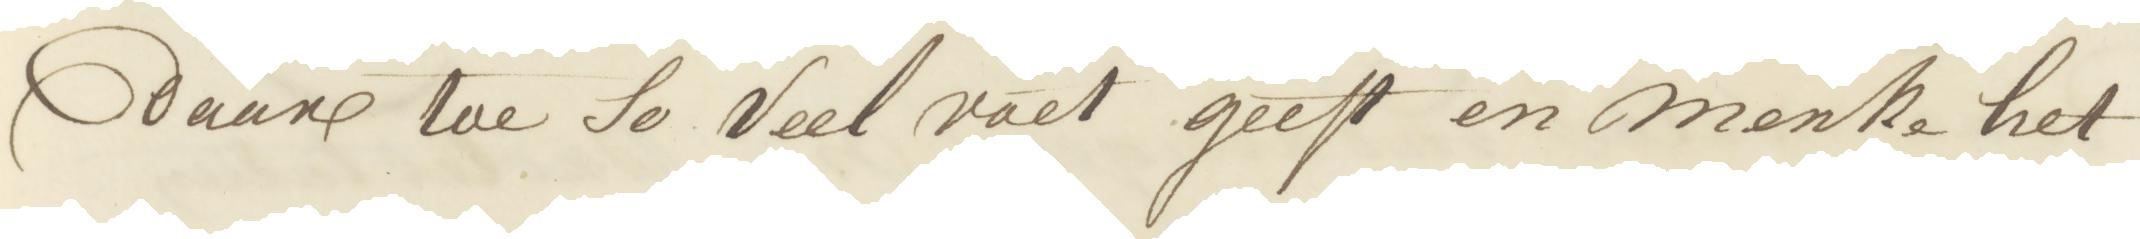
daar toe so veel voet geeft en merke het
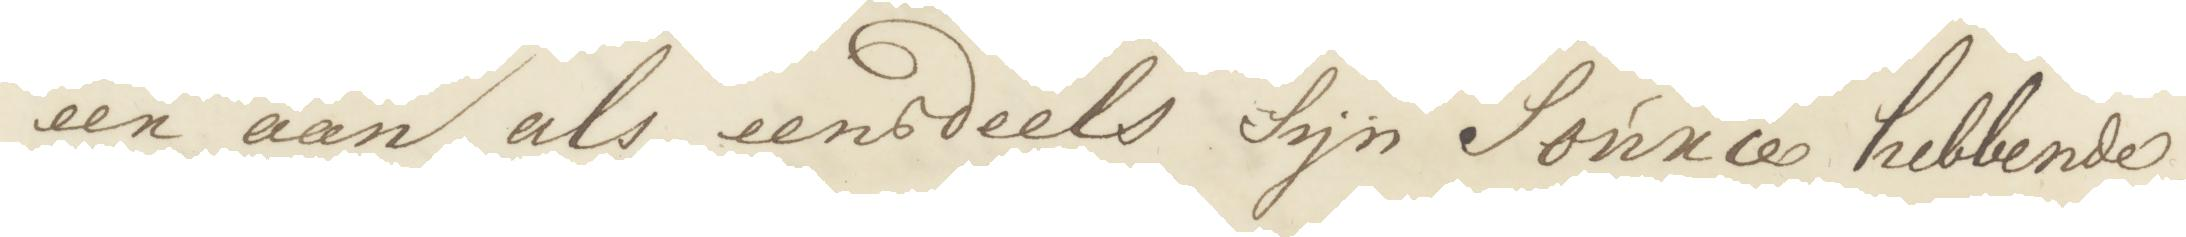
eer aan als eensdeels sijn source hebbende
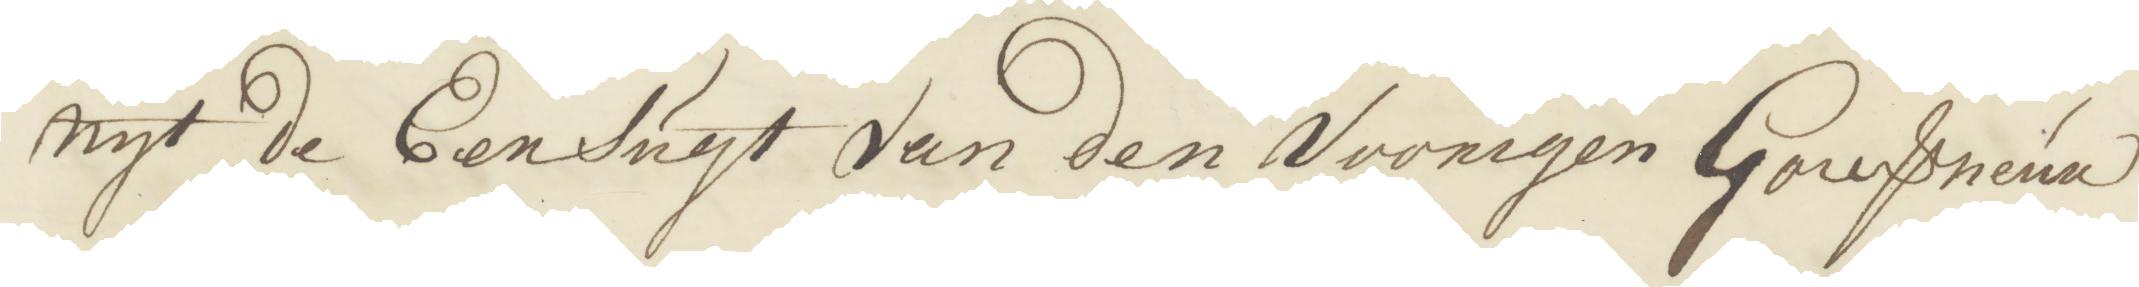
uyt de Eersugt van den voorigen Gouverneur
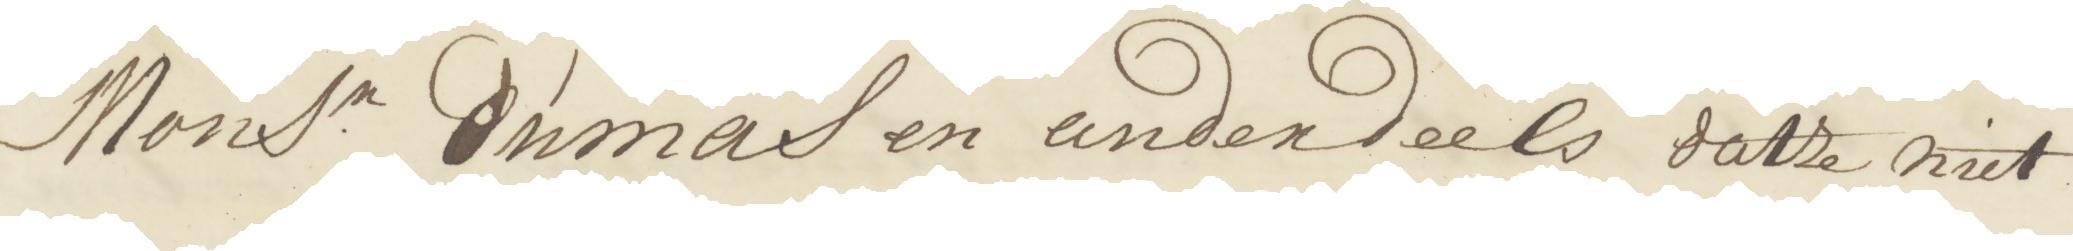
Mons.r dumas en ander deels datze niet
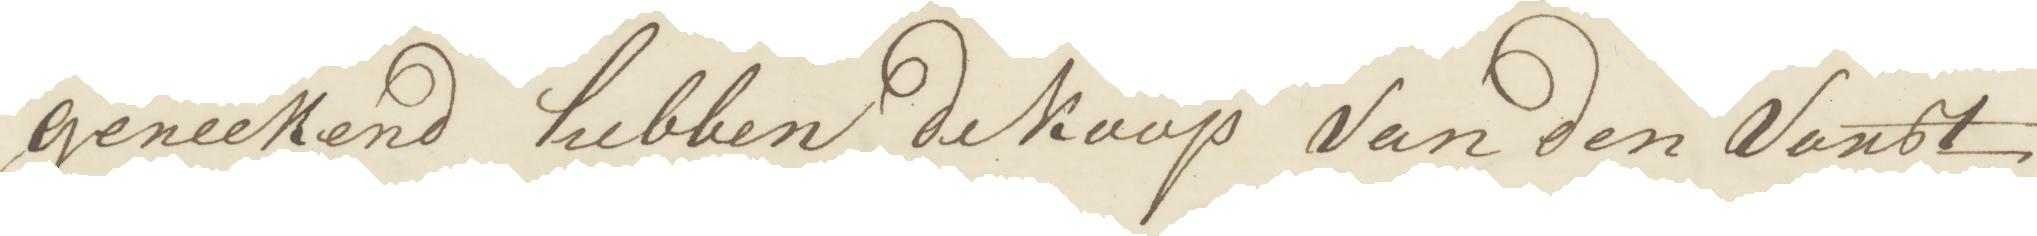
gereekend hebben de koop van den vorst
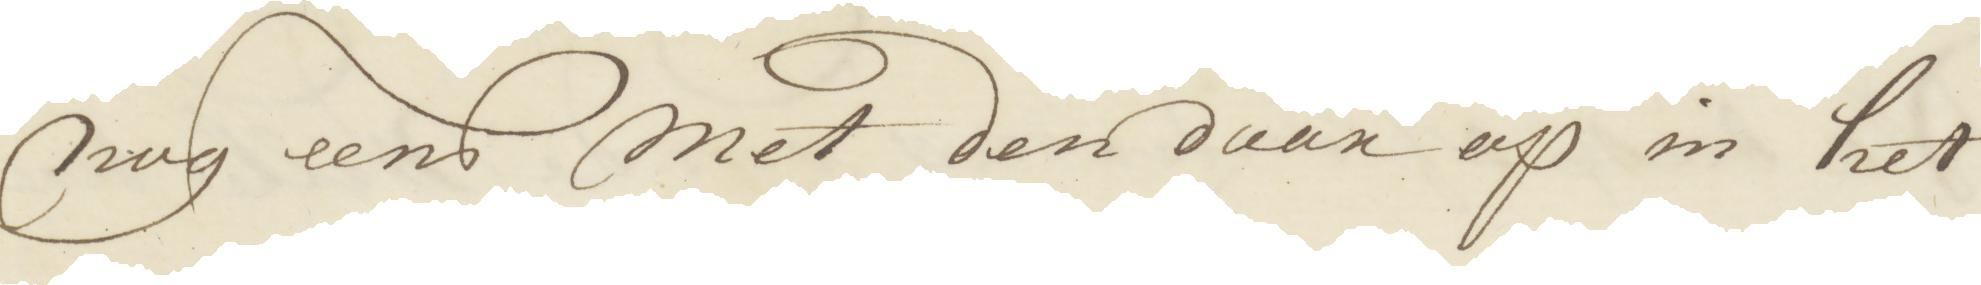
nog eens met den daar op in het
